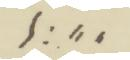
1: „ „
